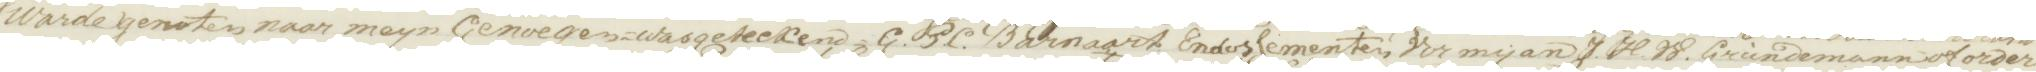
warde genoten naar meyn Genoegen = was geteekend = G. P. C. Barnaart Endossementen Vor mijan J. H. W. Grundemann of order
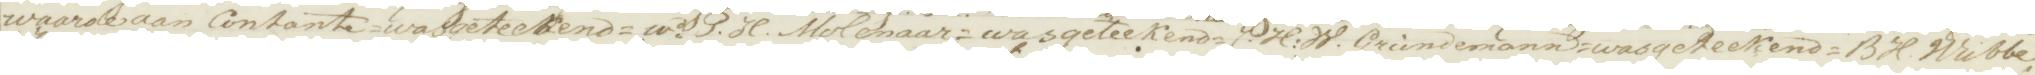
waarde aan Contante was geteekend = w„d P. H. Molenaar = was geteekend = J. H: W. Grundemann = was geteekend = B H. Wubbe,
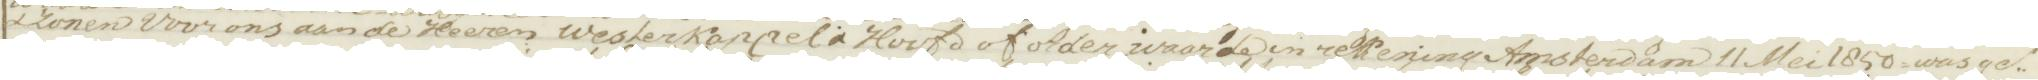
& zonen voor ons aan de Heeren westerkappela Hoofd of order waarde in rekening Amsterdam 11 Mei 1850 = was ge„
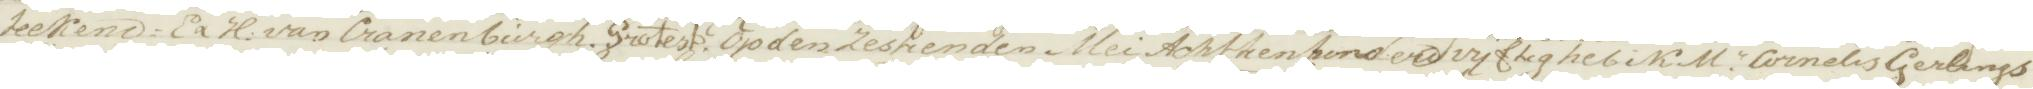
teekend: Ex H: van Cranenbusch, Protest, Op den zestienden Mei Achttienhonderd vyftig heb ik M.r Cornelis Gerlings
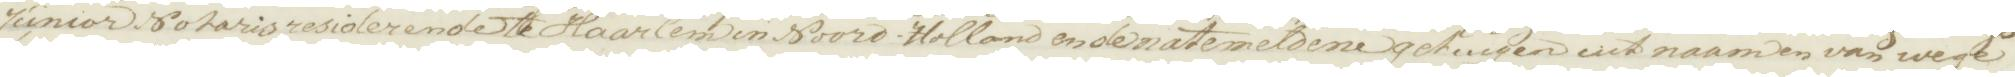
Junior Notaris residerende te Haarlem in Noord-Holland en de natemeldene getuigen uit naam en van wege
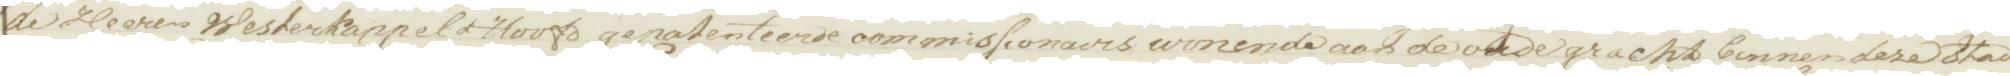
de Heeren Westerkappel & Hoofd gepatenteerde commissionaars wonende aan de oude gracht binnen deze stad
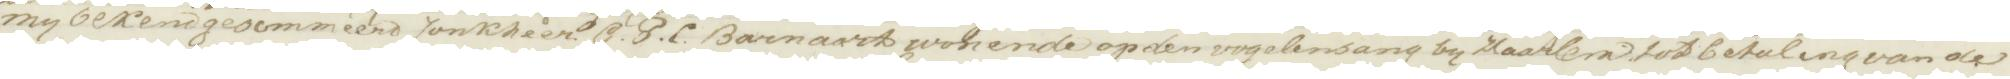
my bekend gesommeerd Jonkheer G. P. C. Barnaart wonende op den vogelensang by Haarlem, tot betaling van de
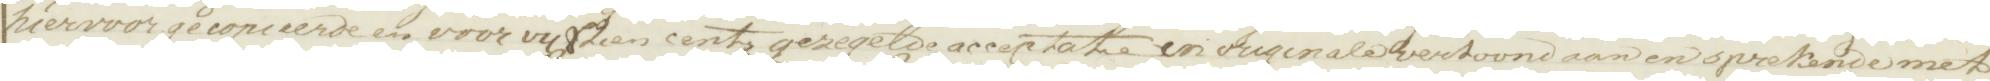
hiervoor gecopieerde en voor vyftien cents gezegelde acceptatie in originale vertoond aan en sprekende met
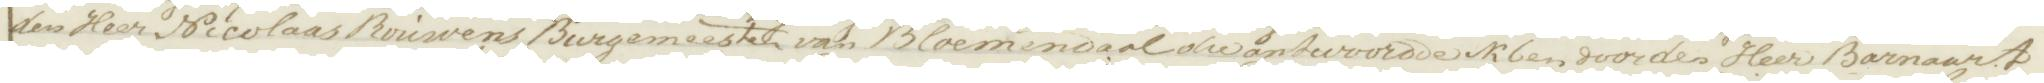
den Heer Nicolaas Rouwens Burgemeester van Bloemendaal die antwoordde ik ben door den Heer Barnaart
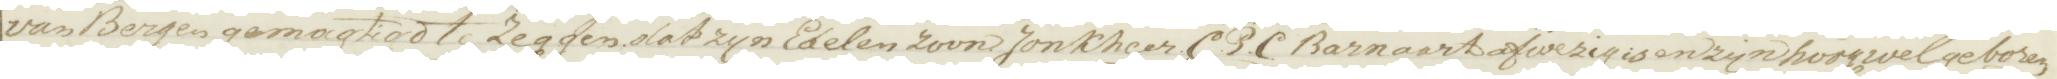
van Bergen gemagtigd te zeggen, dat zyn Edelen zoon Jonkheer G. P. C. Barnaart afwezig is en zijn hoogwelgeboren
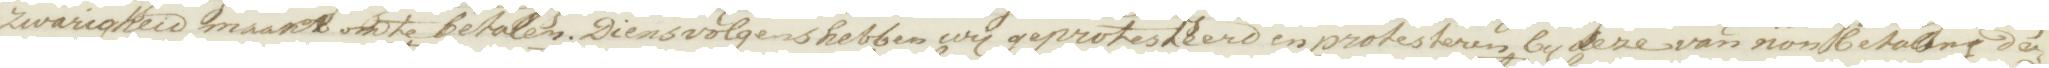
zwarigheid maakt om te betalen. Diens volgens hebben wij geprotesteerd en protesteren, by deze van non betaling der
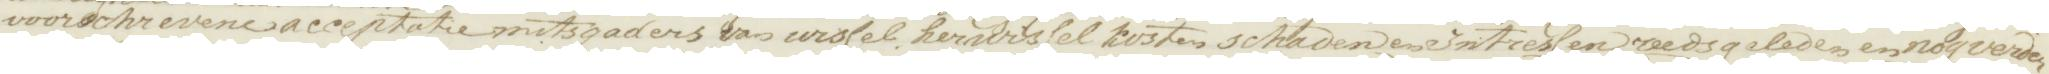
voorschrevene acceptatie mitsgaders van wissel, herwissel kosten schaden en Intressen reeds geleden en nog verder
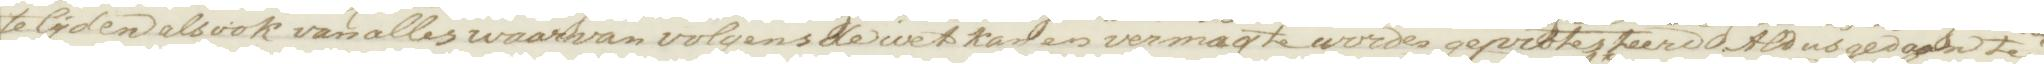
te lijden als ook van alles waarvan volgens de wet kan en vermag te worden geprotesteerd Aldus gedaan te
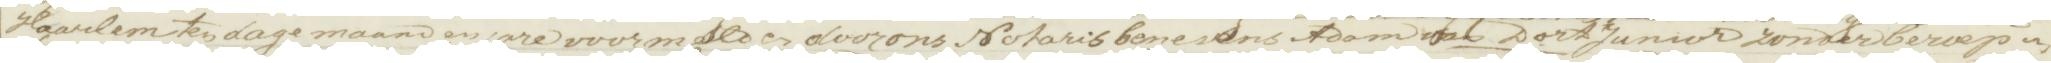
Haarlem ten dage maand en jare voormeld en door ons Notaris benevens Adam van Dort Junior zonder beroep in
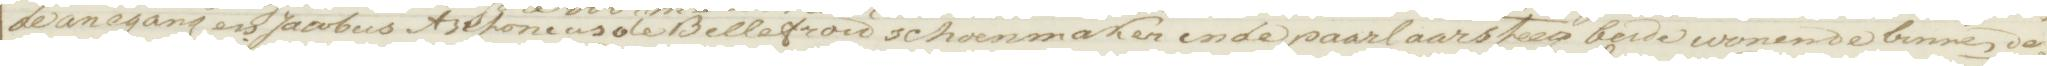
de anegang en Jacobus Antonius de Bellefroid schoenmaker in de paarlaarsteeg beide wonende binnen de
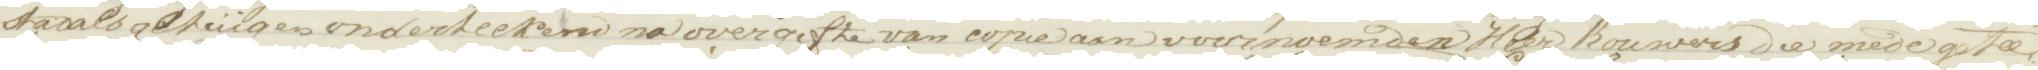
stad als getuigen onderteekend na overgifte van copie aan voornoemden Heer Rouwers die mede getee„
